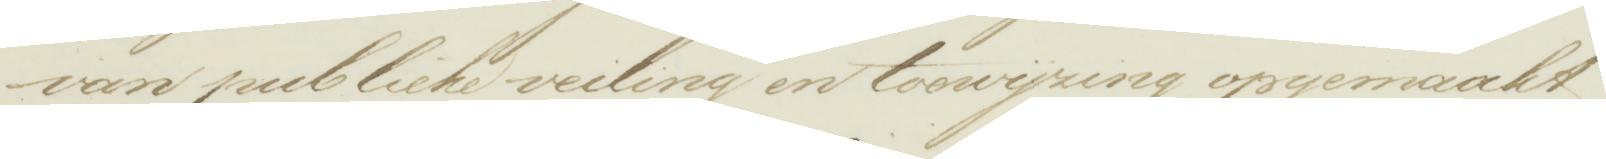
van publieke veiling en toewijzing opgemaakt
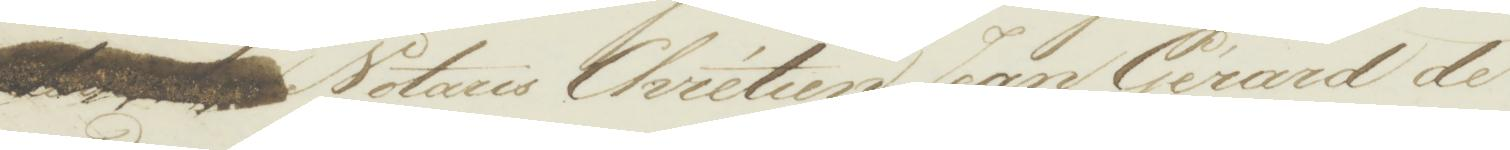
Door den Notaris Chrétien Jean Gérard de
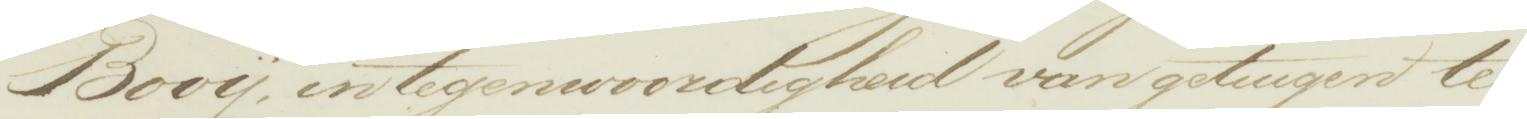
Booij, in tegenwoordigheid van getuigen te
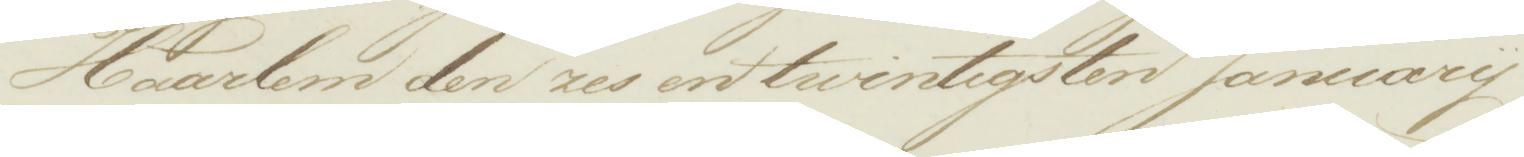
Haarlem den zes en twintigsten Januarij
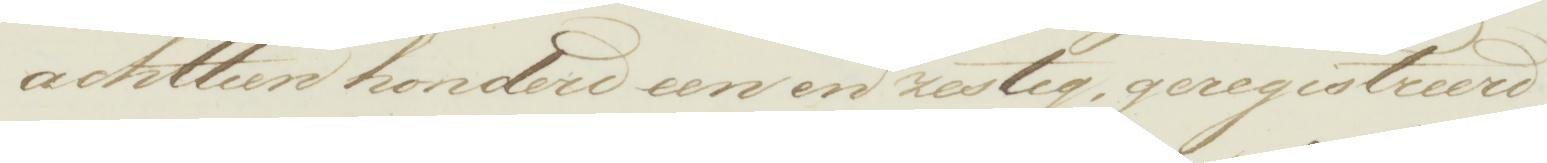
achttien honderd een en zestig, geregistreerd
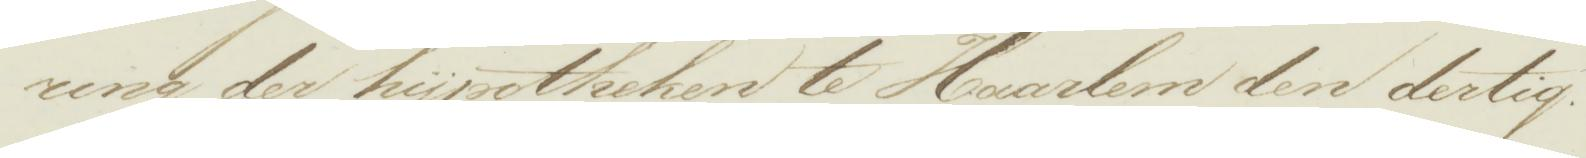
ring der hijpotheken te Haarlem den dertig.
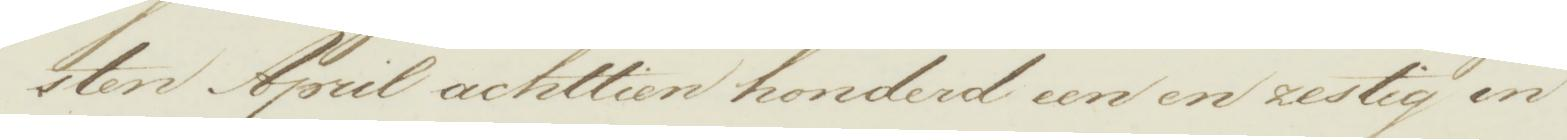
sten April achttien honderd een en zestig in
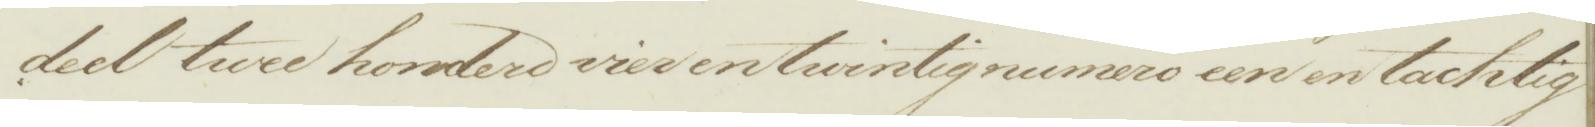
deel twee honderd vier en twintig numero een en tachtig
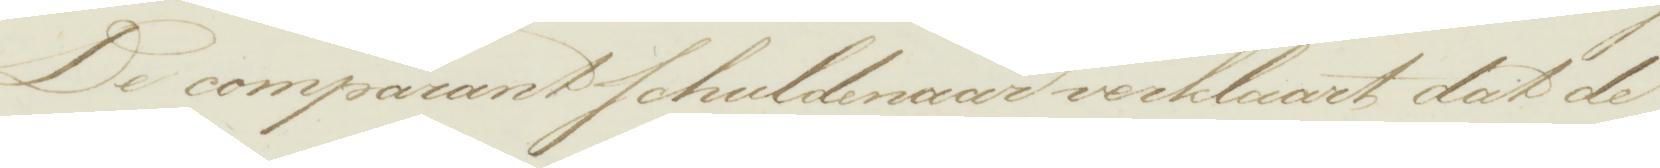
De comparant schuldenaar verklaart dat de
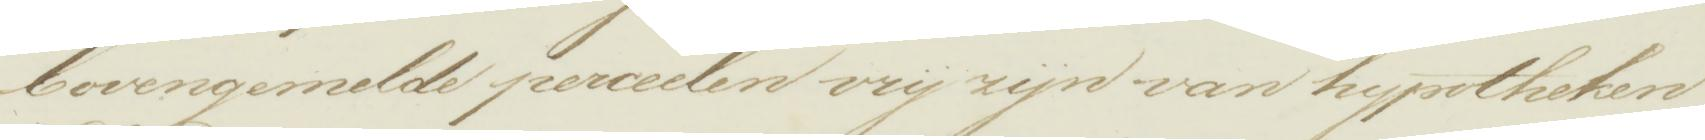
bovengemelde perceelen vrij zijn van hypotheken
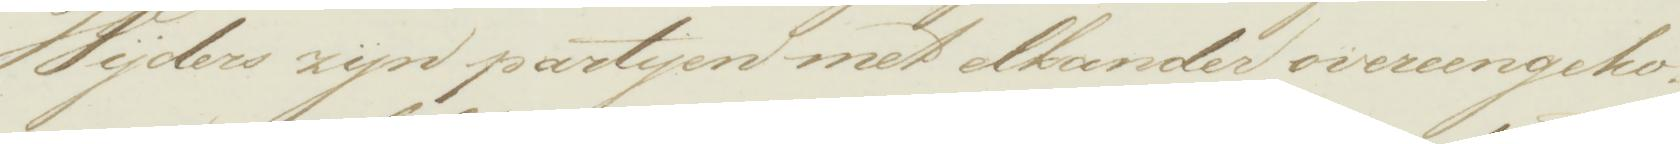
Wijders zijn partijen met elkander overeengeko„
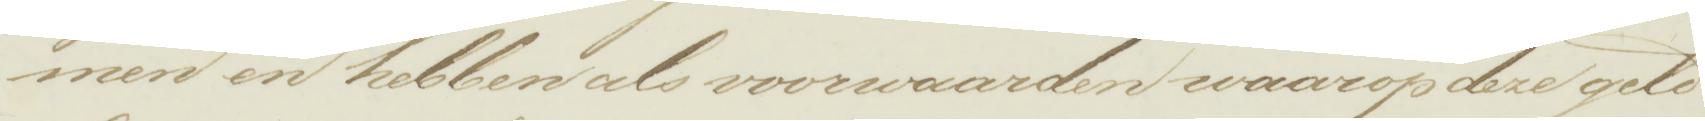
men en hebben als voorwaarden waarop deze geld
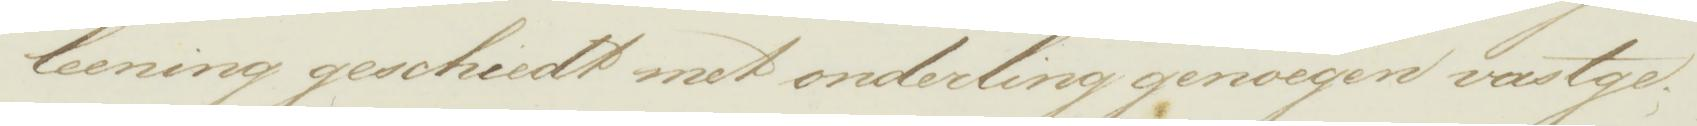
leening geschiedt met onderling genoegen vastge„
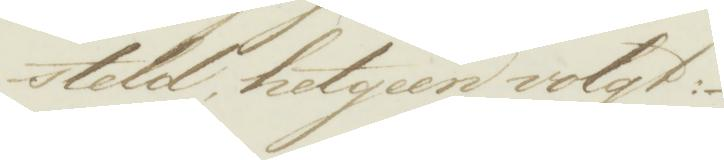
steld, hetgeen volgt:
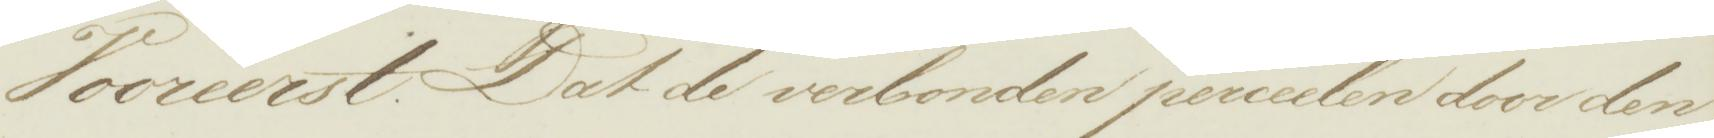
Vooreerst. Dat de verbonden perceelen door den
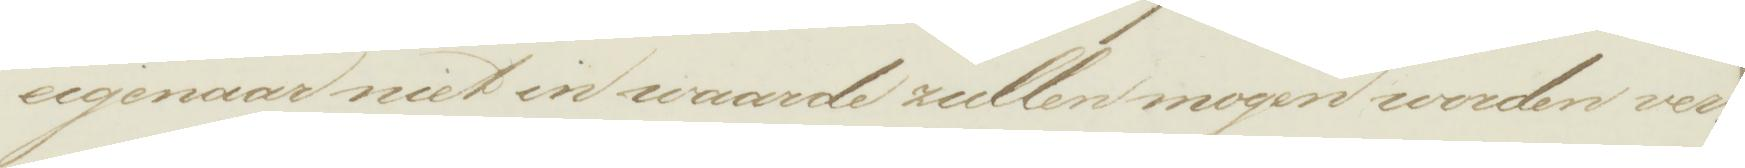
eigenaar niet in waarde zullen mogen worden ver
